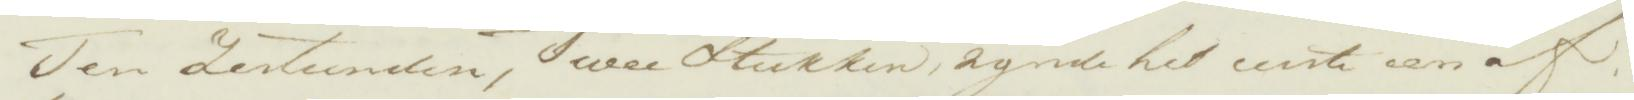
Ten Zestienden, Twee stukken, zynde het eerste een af.
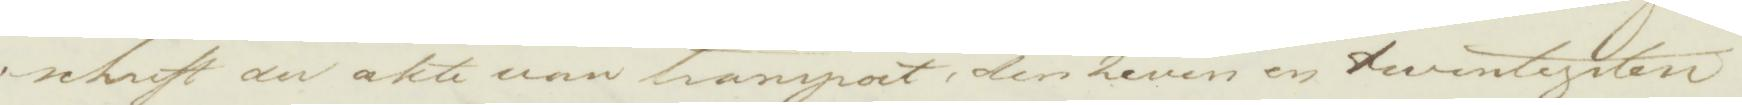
schrift der akte van transport, den zeven en twintigsten
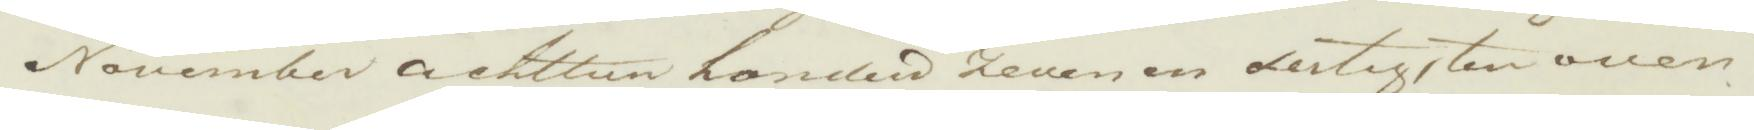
November achttien honderd zeven en dertig, ten over„
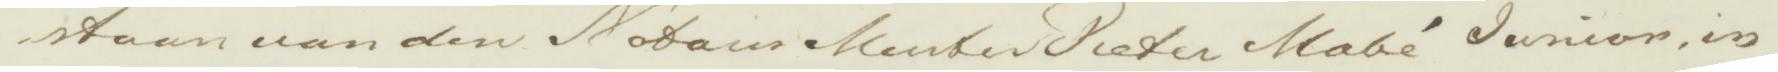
,staan van den Notaris Meester Pieter Mabé Iunior, in
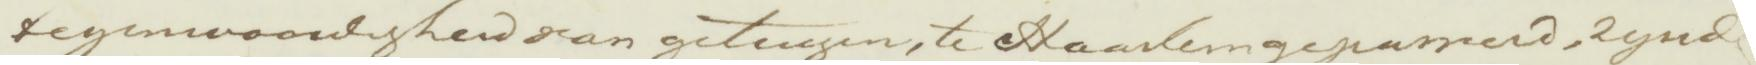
tegenwoordigheid van getuigen, te Haarlem gepasseerd, zynde
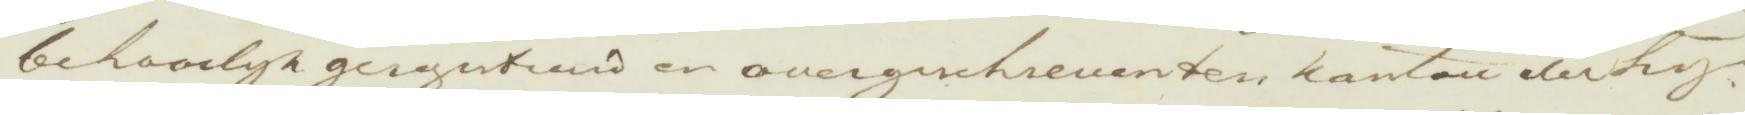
behoorlyk geregistreerd en overgeschreven ten kanton der hy
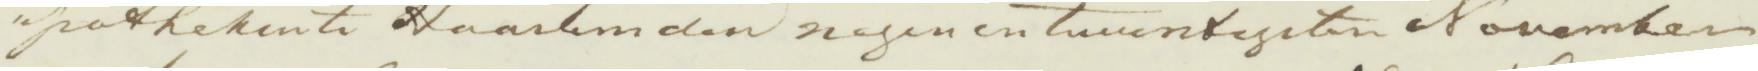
„potheken te Haarlem den negen en twintigsten November
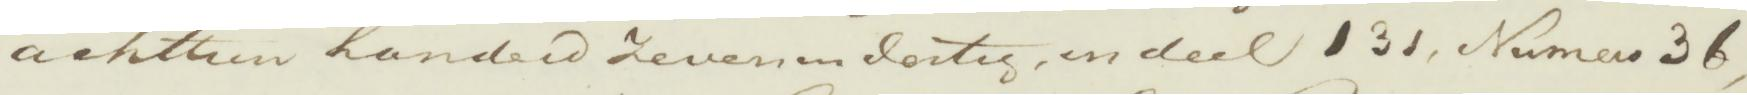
achttien honderd Zeven en dertig, in deel 131, Numero 36
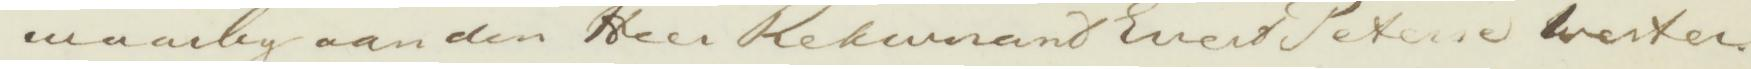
waarby aan den Heer Rekwirant Evert Peterse wester.
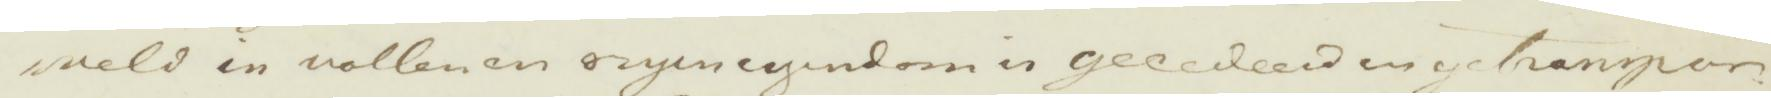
„veld in vollen en vryen eigendom is gecedeerd en getranspor„
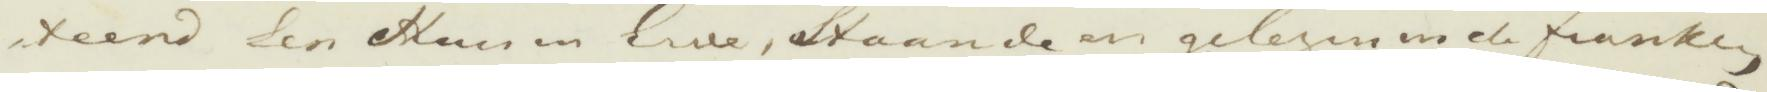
„teerd Een Huis in Erve, staande en gelegen in de franken
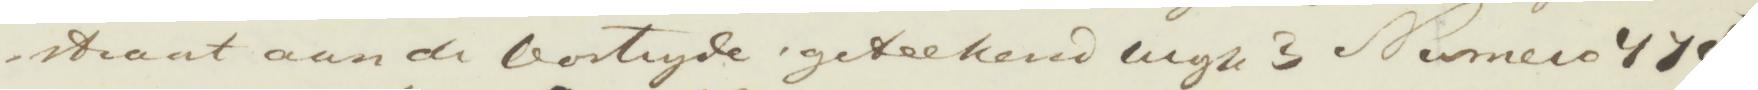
„straat aan de Oostzyde, geteekend wyk 3 Numero 478
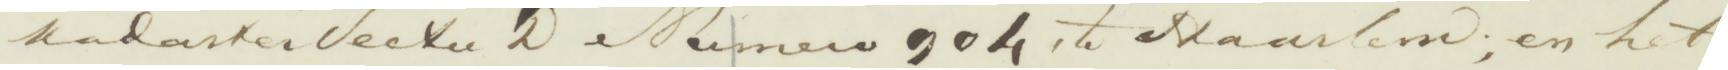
kadaster Sectie D Numero 904, te Haarlem; en het
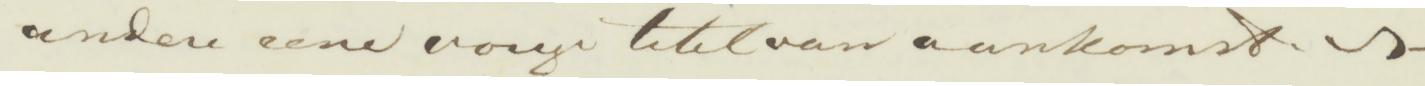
andere eene vorige titel van aankomst.
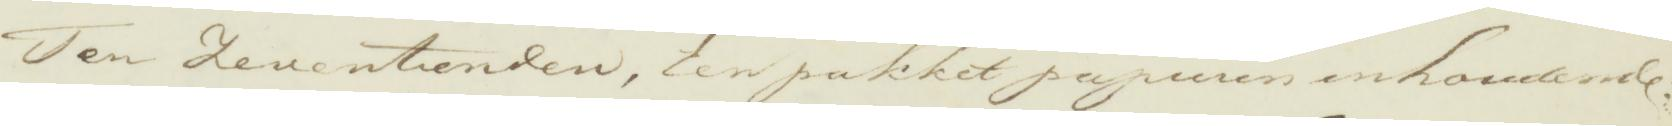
Ten Zeventienden, Een pak het papieren inhoudende
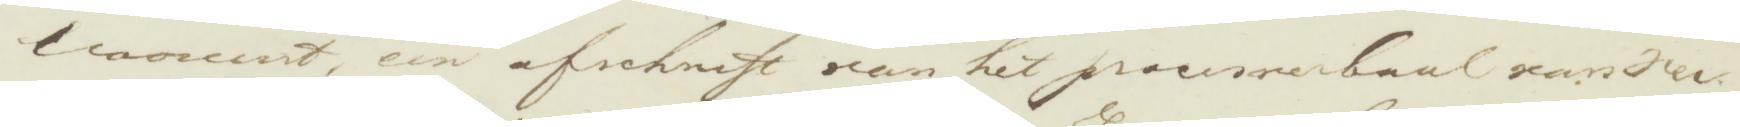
vooreerst, een afschrift van het procesverbaal van vei,
